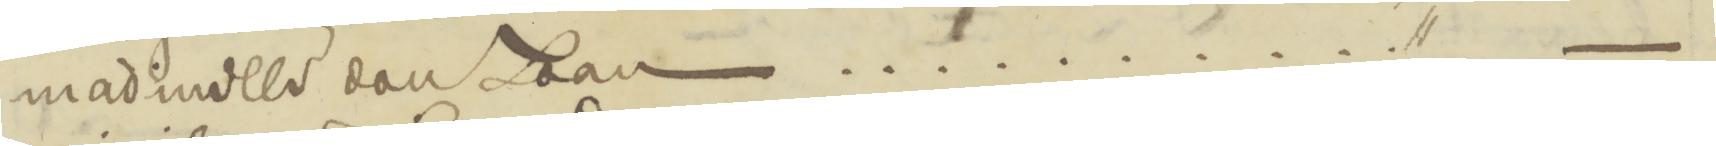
madinelle dan Loan . . . . . . . . . . „ —
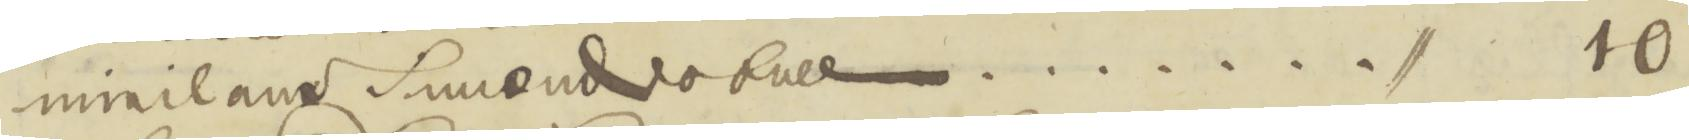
mirilane smonde obule . . . . . . . „ 10
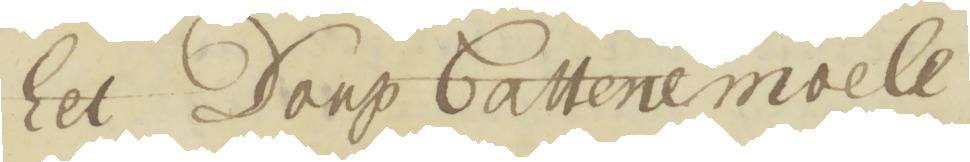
het Dorp battene moele
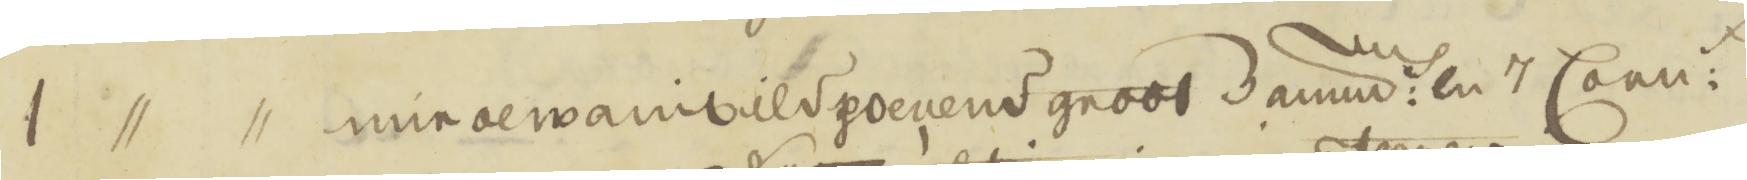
1„ „ mir oewanivile poerene groot 3 amm:s en 7 Corn:s
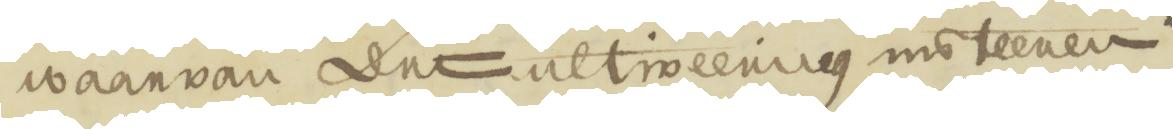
waarvan ter Cultiveering insteeren
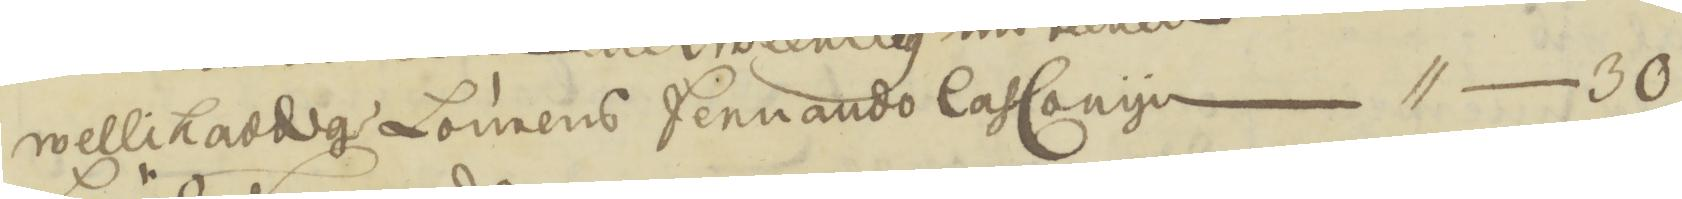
wellikaedeg Lourens fernando Cascorijn „ — 30
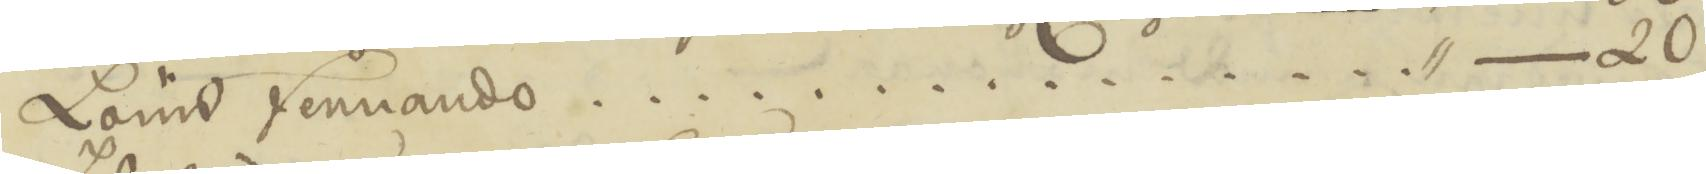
Louis fernando . . . . . . . . . . . . . . . „ — 20
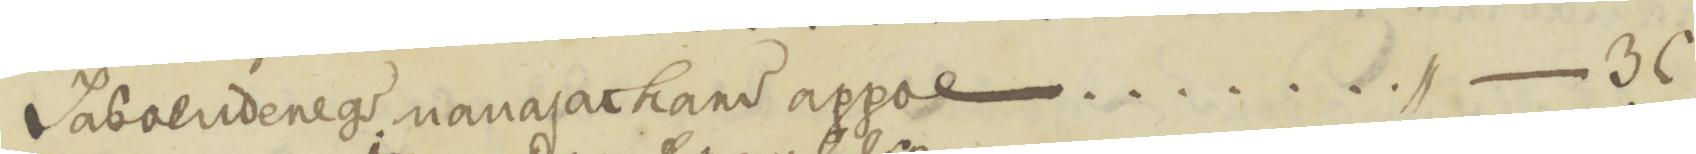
Iasoenderege nanajachare appoe . . . . . . . „ — 35
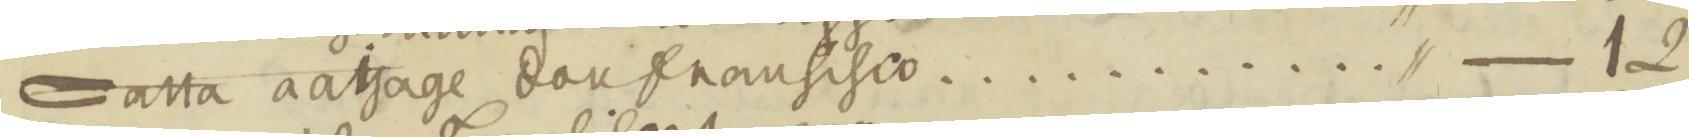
Catta aatjage don fransisco. . . . . . . . . . . „ — 12
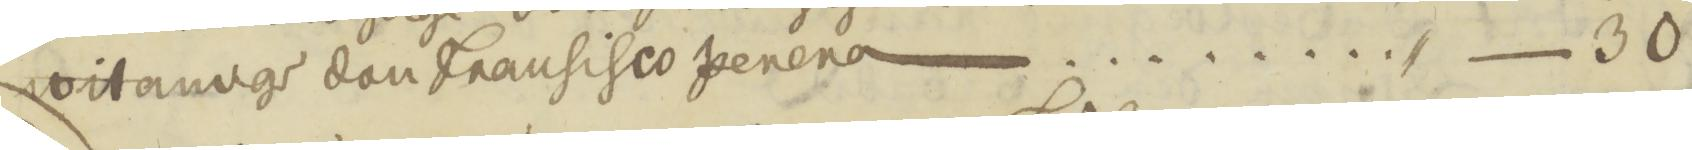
witanege don fransisco perera . . . . . . . . „ — 30
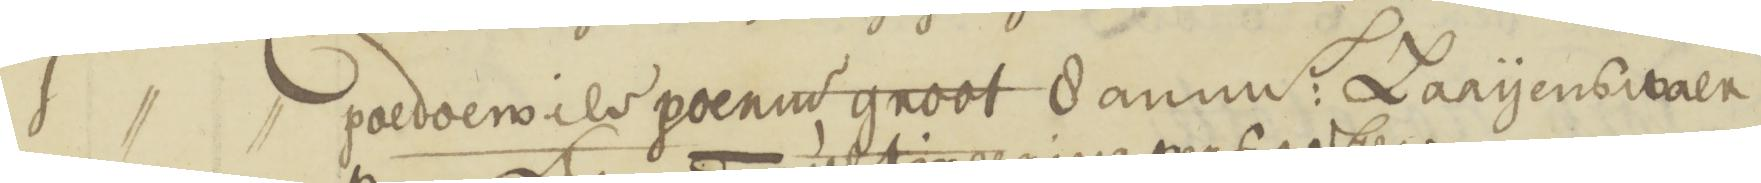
1 „ „ poedoewele poerne groot 8 amm:s Zaaijens waer
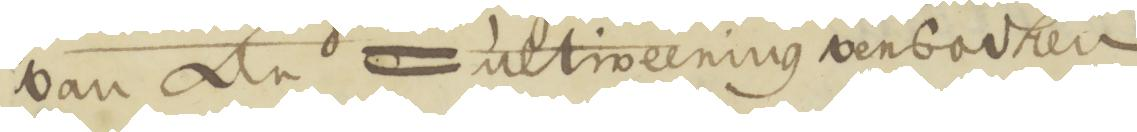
van ter Cultiveering versoeken
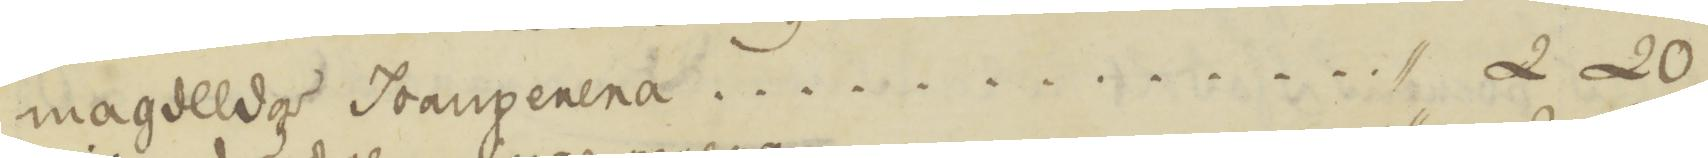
magellege Ioanperera. . . . . . . . . . . . . „ 2 20
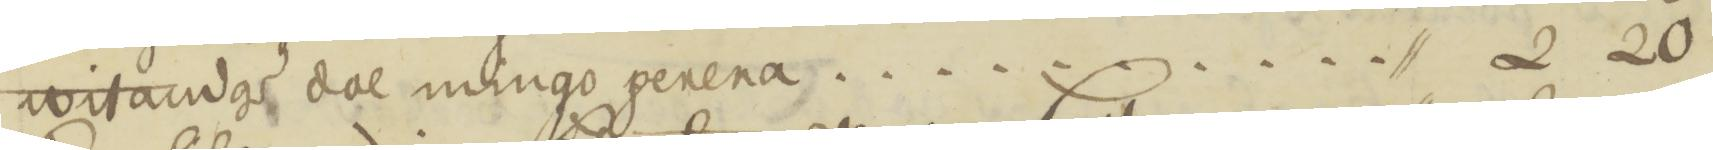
witanege doe mingo perera. . . . . . . . . . „ 2 20
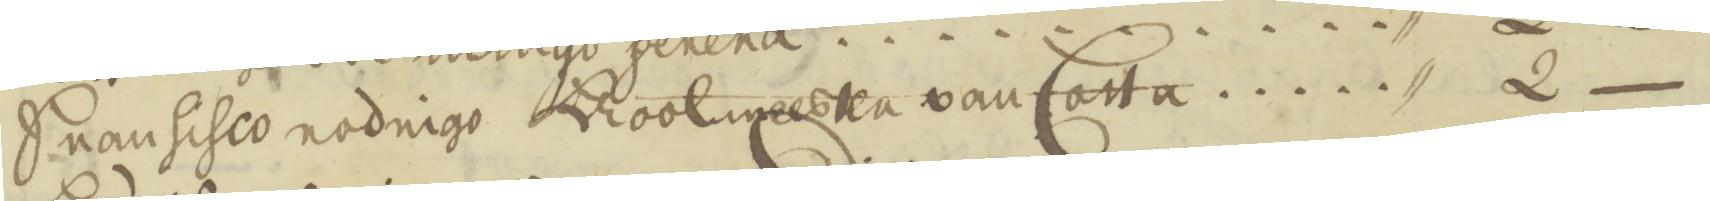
Fransisco rodrigo Schoolmeester van Costa. . . . . „ 2 —
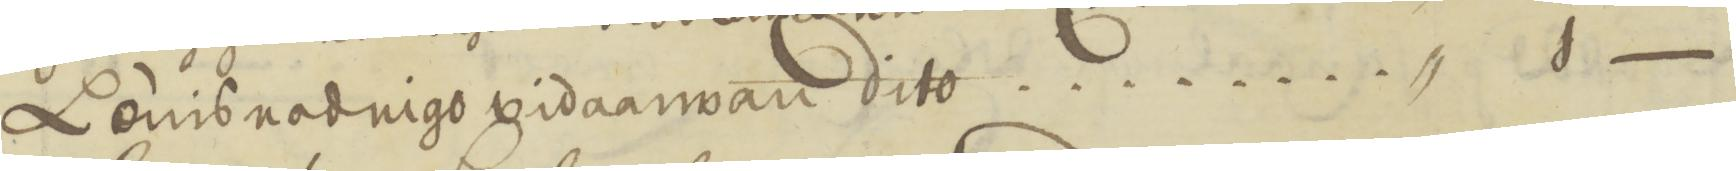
Louis rodrigo vidaan van dito . . . . . . . . „ 1 —
